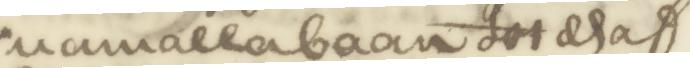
namallabaar tot den af
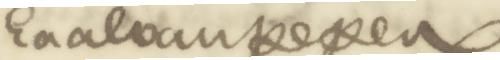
haal van peper
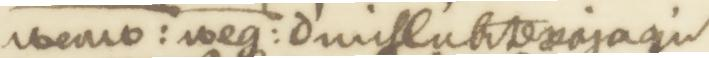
werw:s weg:s d’mislukte vajagie
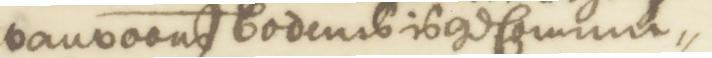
van voors bodems is gecommu„
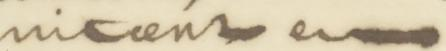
niceert en
